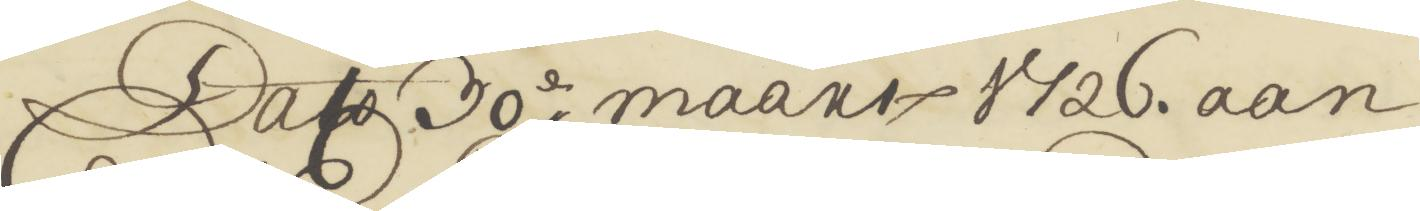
Dato 30„e maart 1726. aan
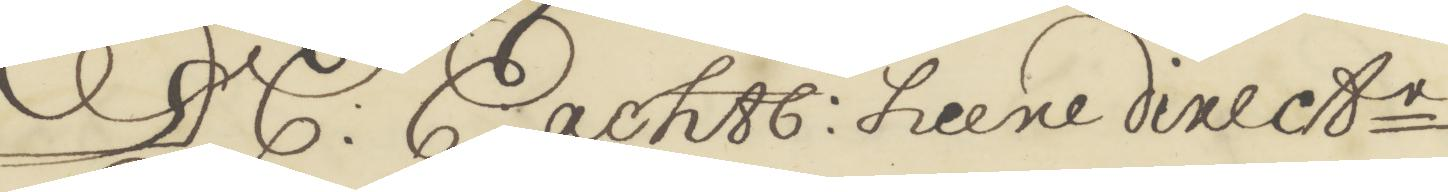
D E: E: achtb: heere direct=r
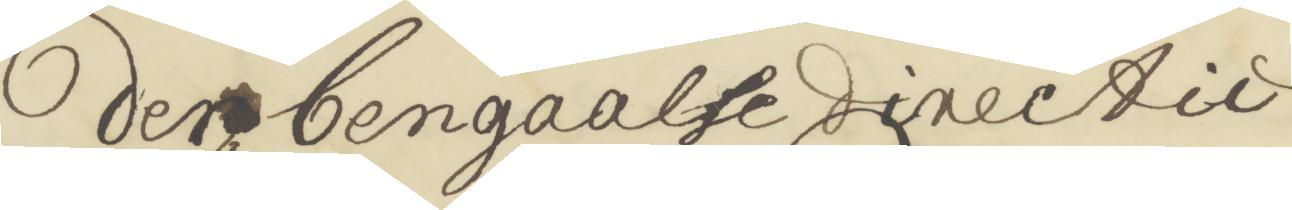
der bengaalse directie
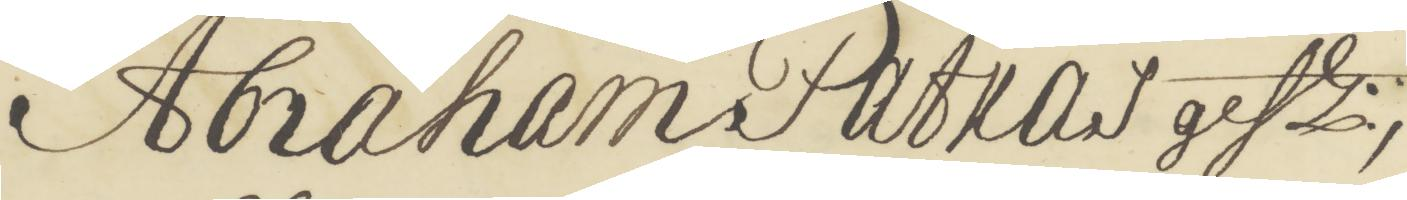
Abraham Patras gesz:,
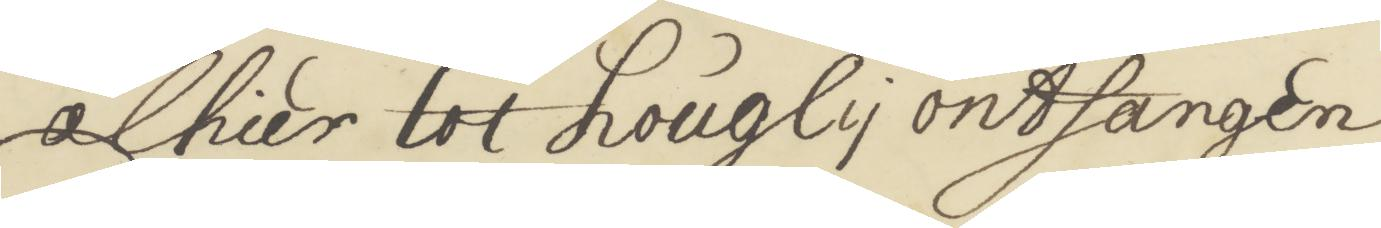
alhier tot houglij ontfangen
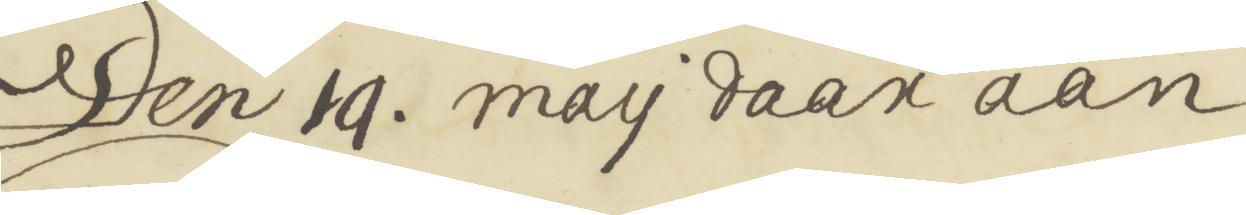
Den 14. maij daar aan
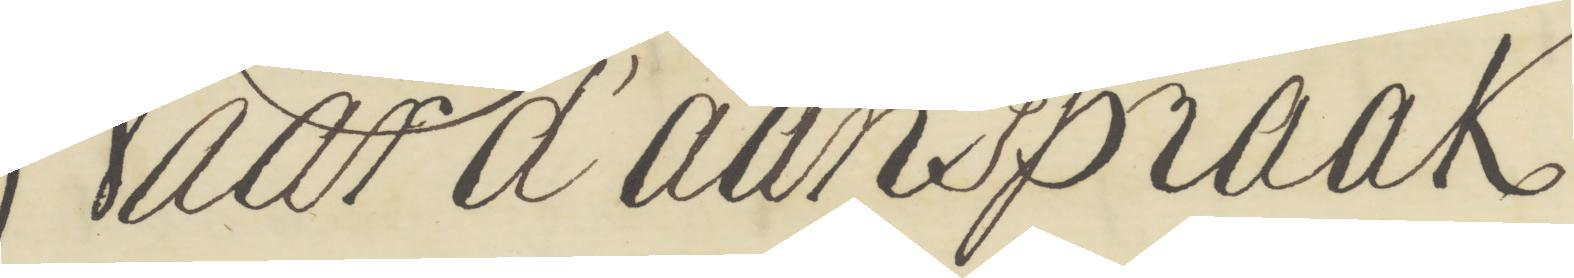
Waar d'aanspraak
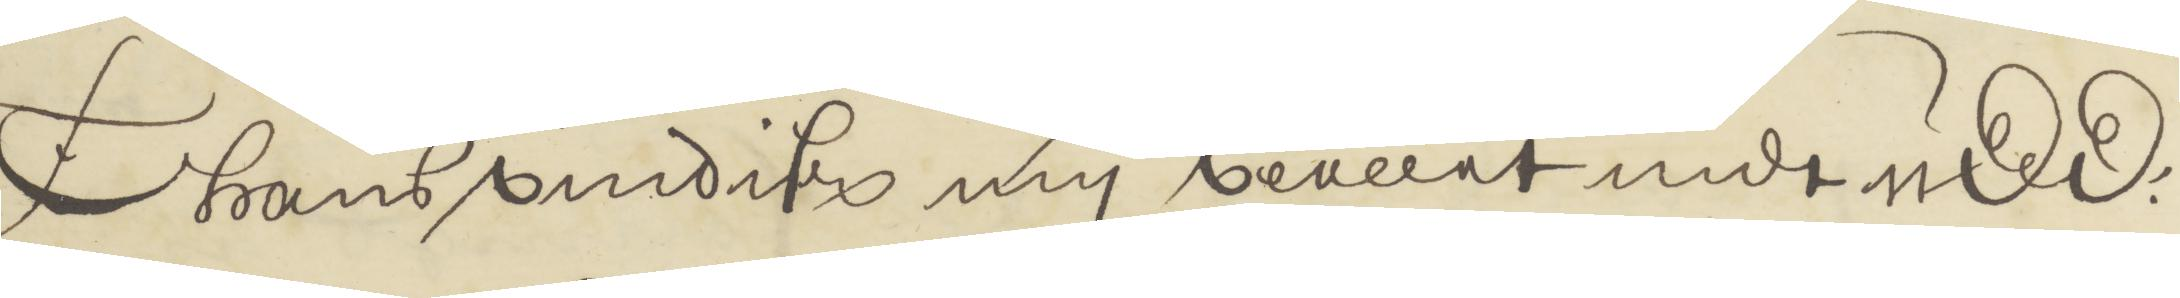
Thans vind ik mij vereert met uEE:
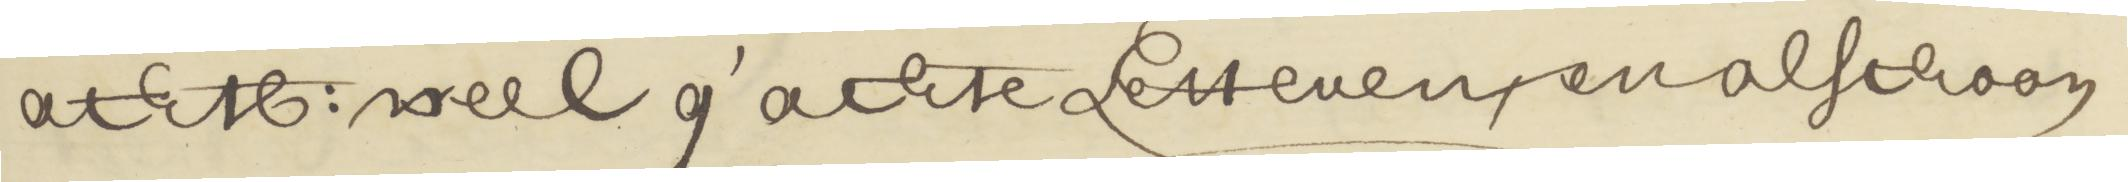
achtb: veel g’achte Letteren, en alschoon
